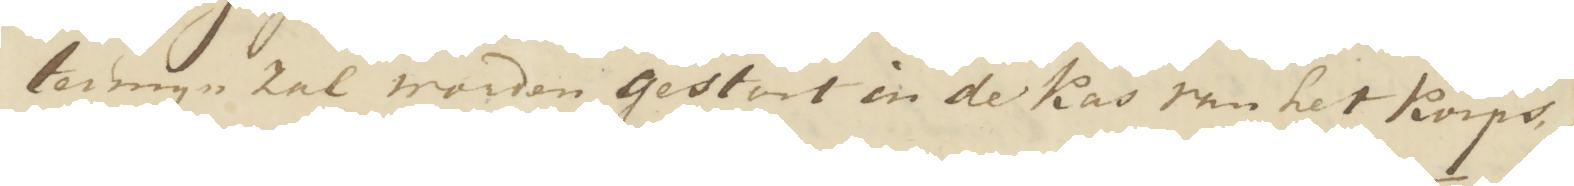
termyn zal worden gestort in de kas van het korps,
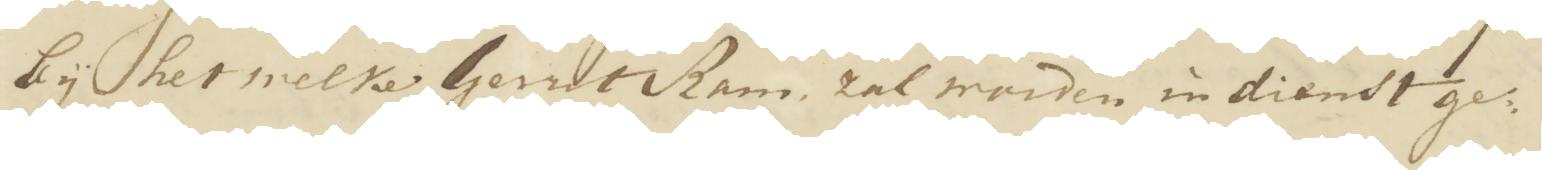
bij het welke Gerrit Ram, zal worden in dienst ge„
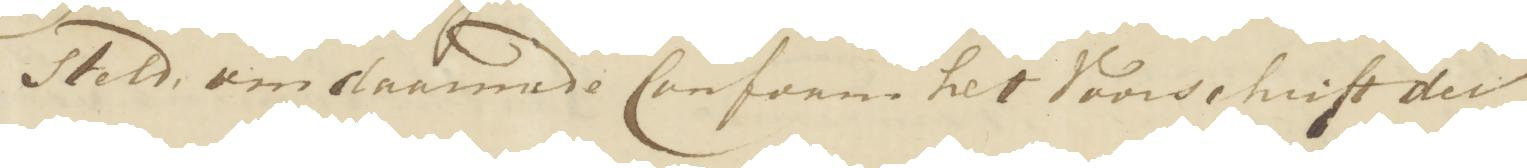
steld, om daarmede Conform het Voorschrift der
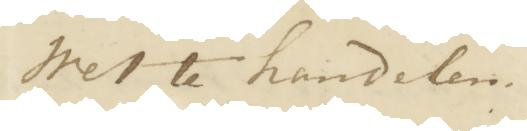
wet te handelen.
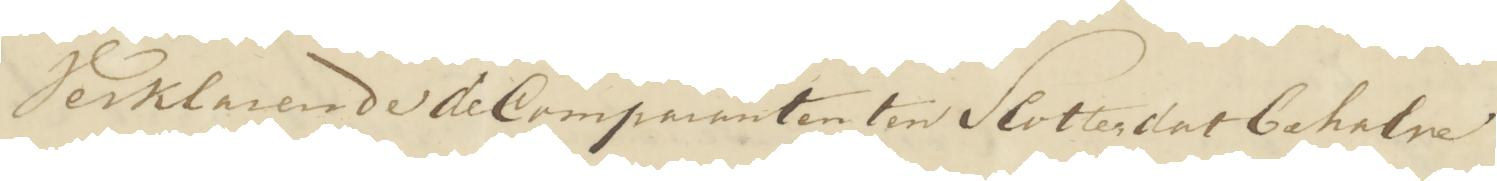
Verklarende de Comparanten ten Slotte, dat behalve
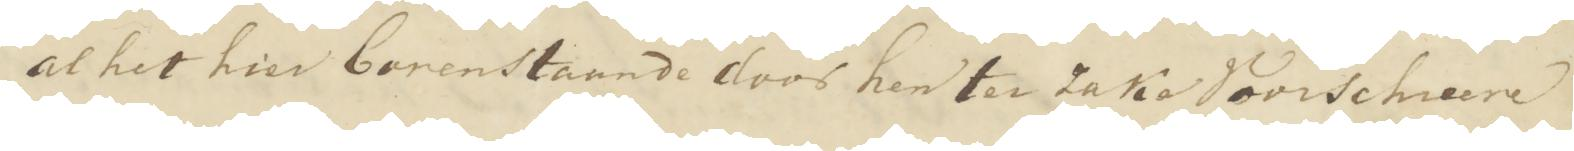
al het hier bovenstaande door hen ter zake Voorschreeve
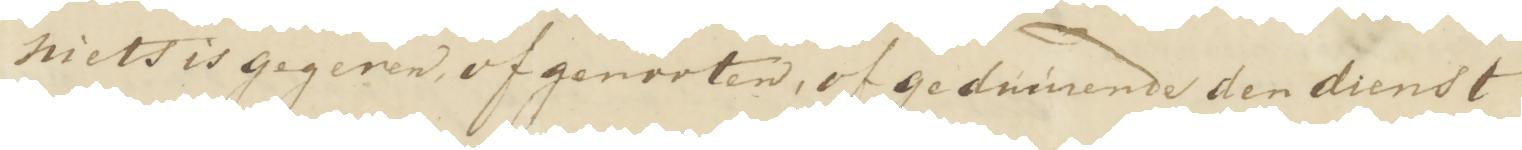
niets is gegeven, of genooten, of geduurende den dienst
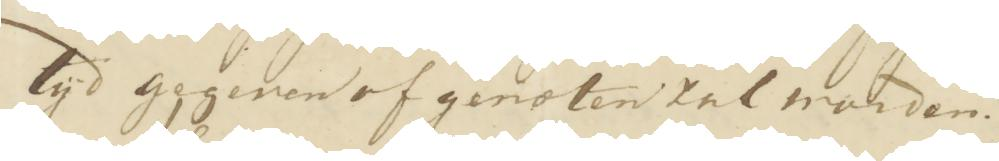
tijd gezeven of genoten zal warden.
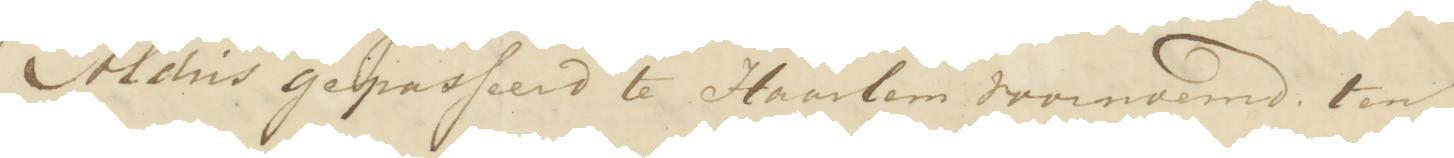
Aldus gepasseerd te Haarlem voornoemd, ten
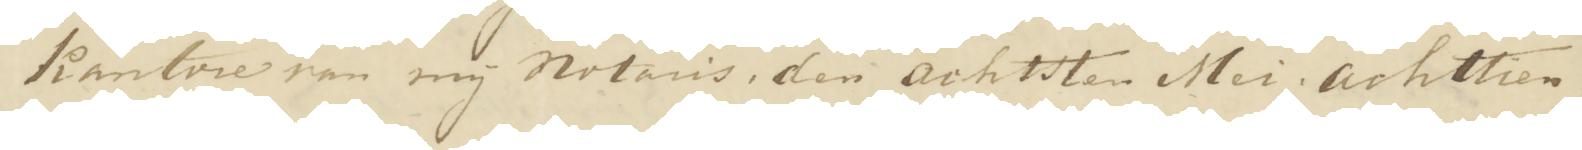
kantore van mij Notaris, den achtsten Mei, achttien
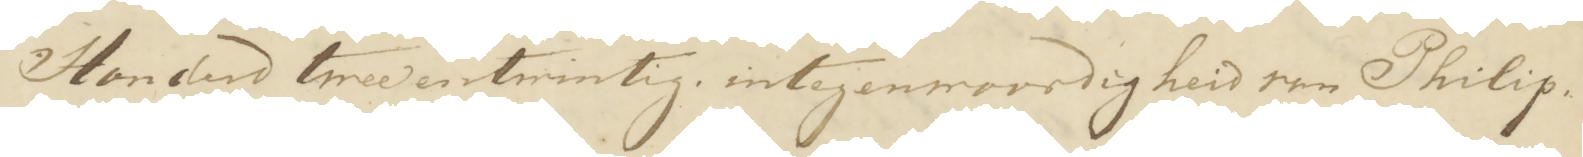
Honderd twee en twintig, integenwoordigheid van Philip,
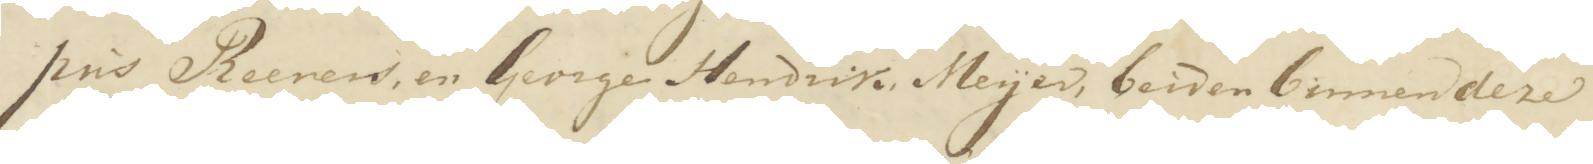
pus Reevens, en George Hendrik, Meijer, beiden binnen deze
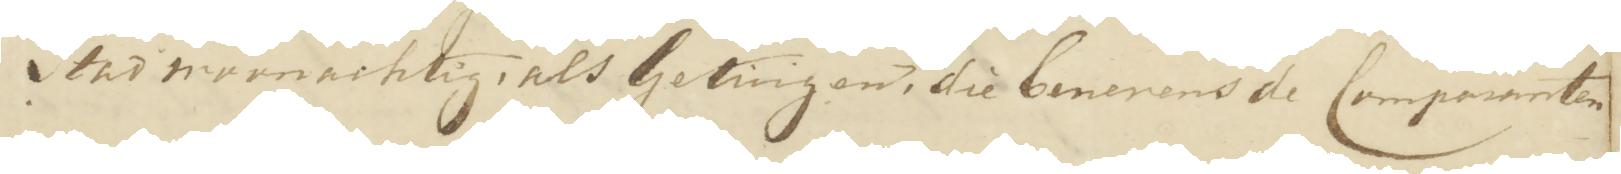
stad woonachtig, als Getuigen, die benevens de Comparanten
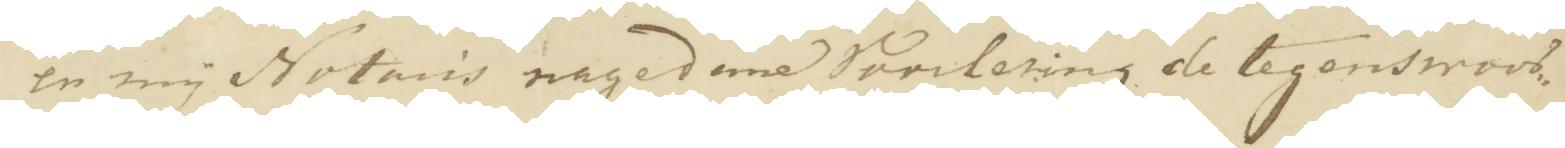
en mij Notaris nagedane Voorlezing de tegenswoor„
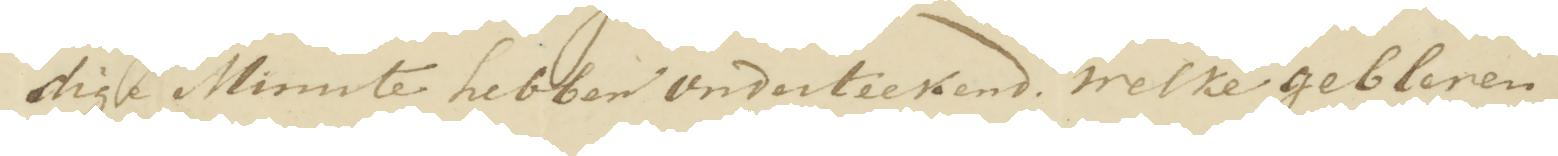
dige Minute hebben onderteekend, welke gebleven
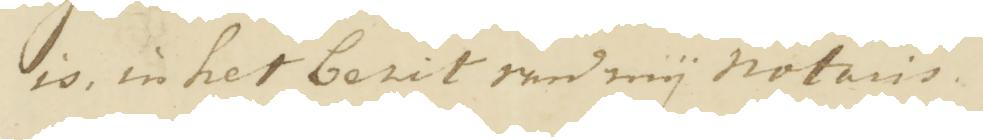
is, in het bezit van mij notaris.
